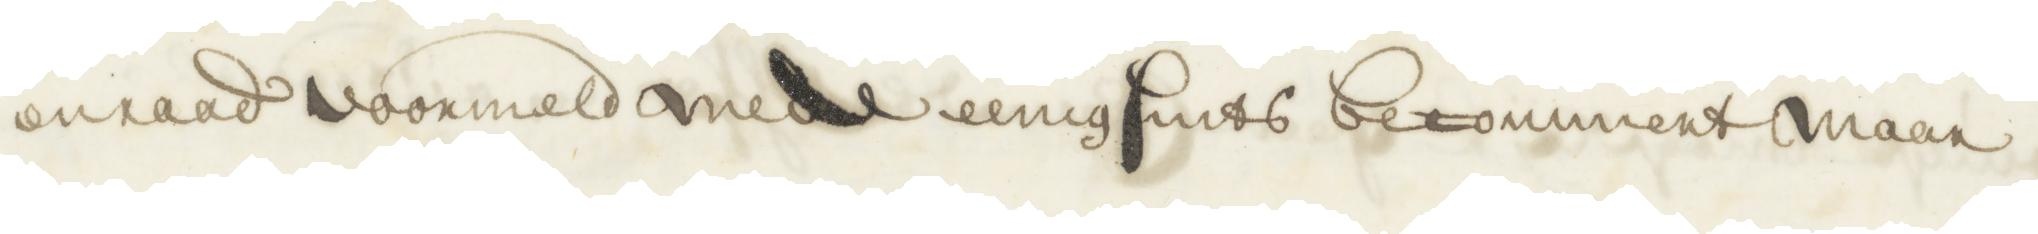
enraad voormeld mede eenigsints becommert maar
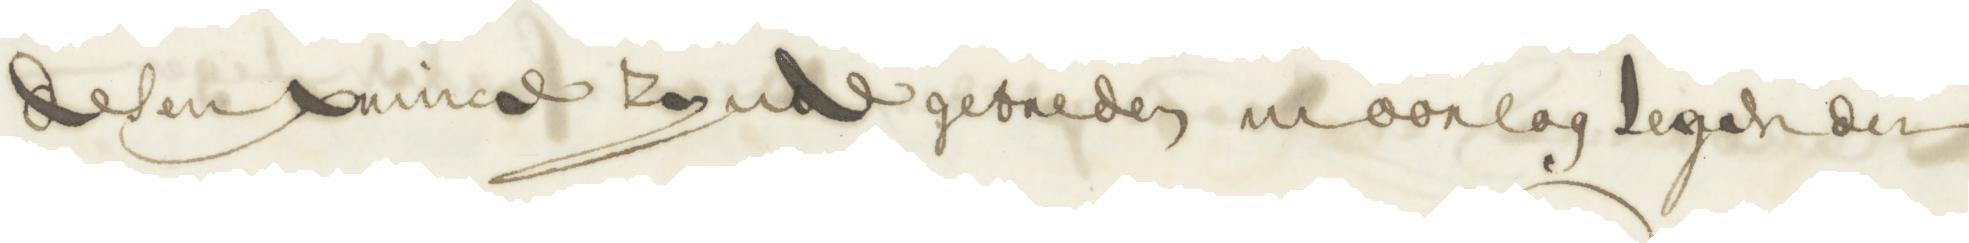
desen prince zynde getreden in oorlog tegen den
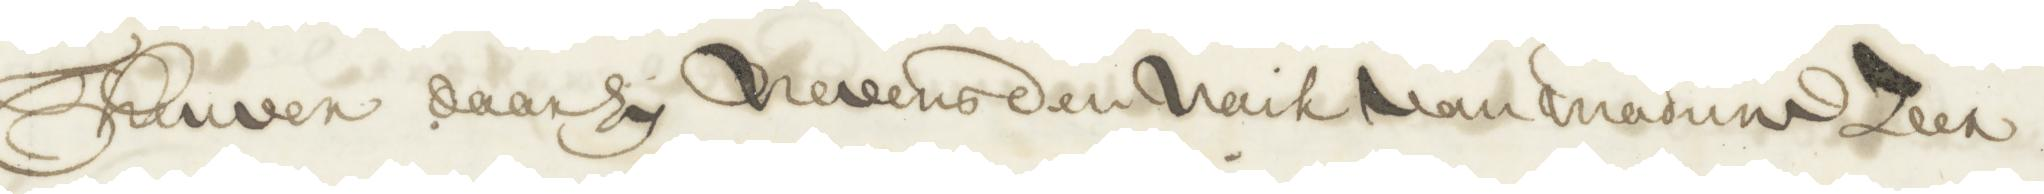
Theuver daarsij nevens den naik van madure zeer
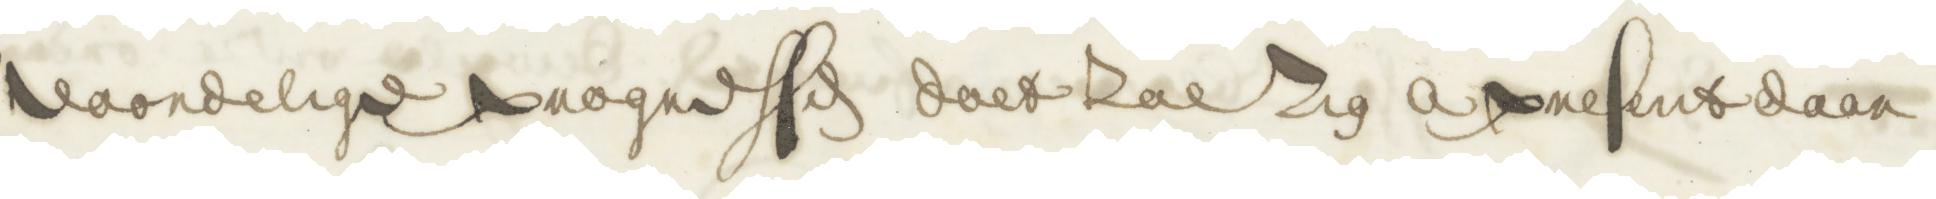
voordelige progressen doet zal zig a present daar
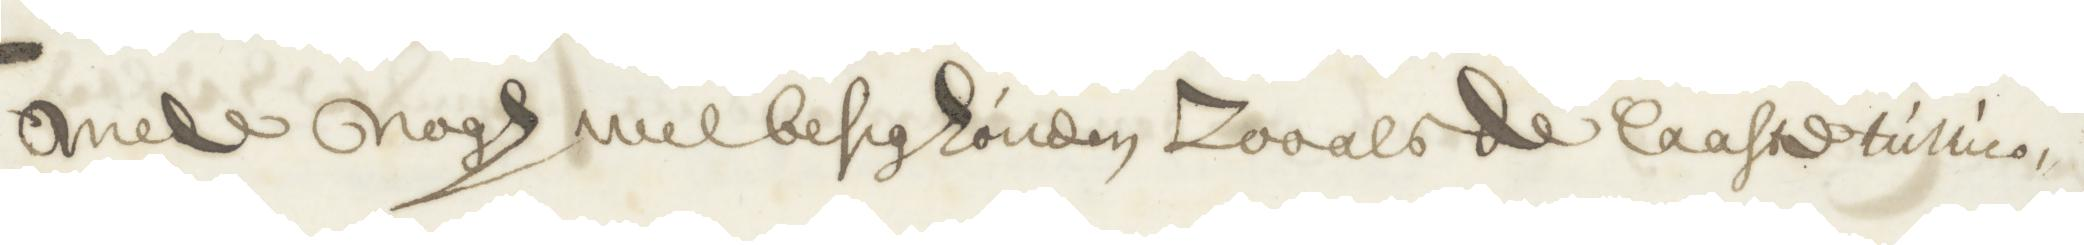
mede nogh welbesighouden zooalsde laaste tutuco„
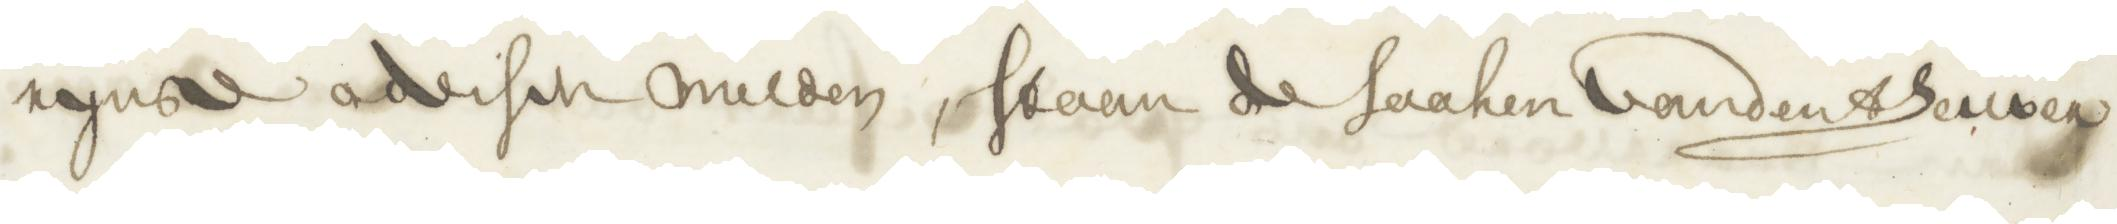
rijnse advisen melden, staan desaaken vandentheuver
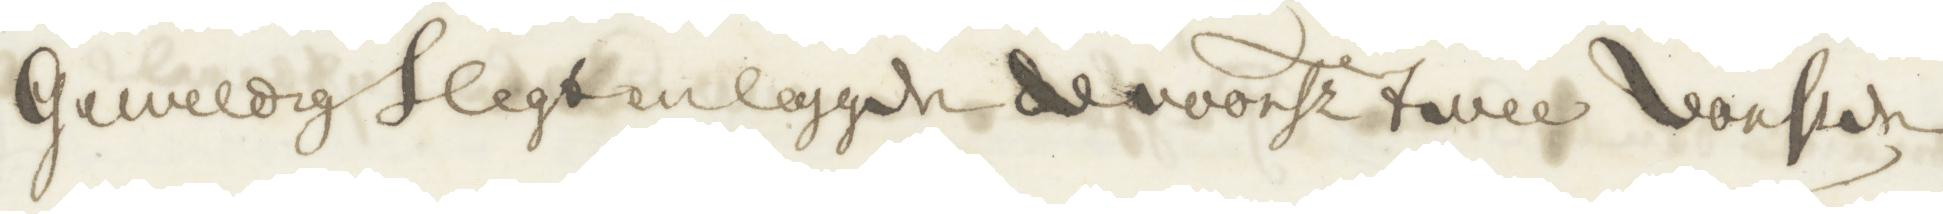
geweldigslegt enleggen devoorsz twee vorsten
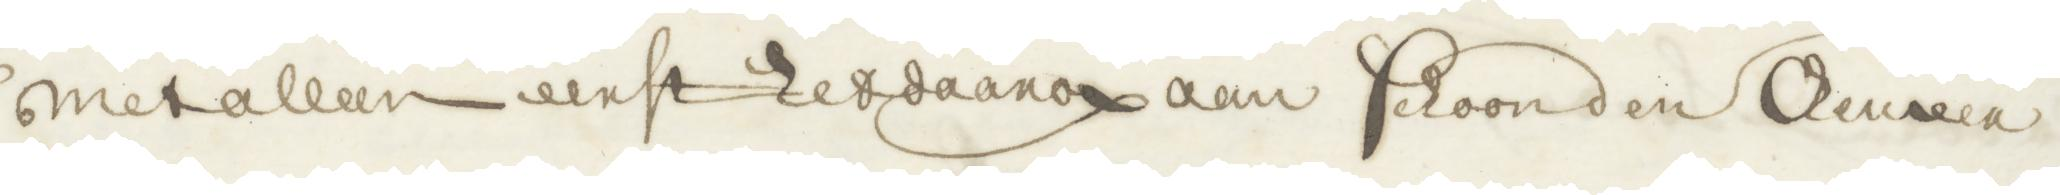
metalleen eerst hetdaarop aan schoonden Chenver
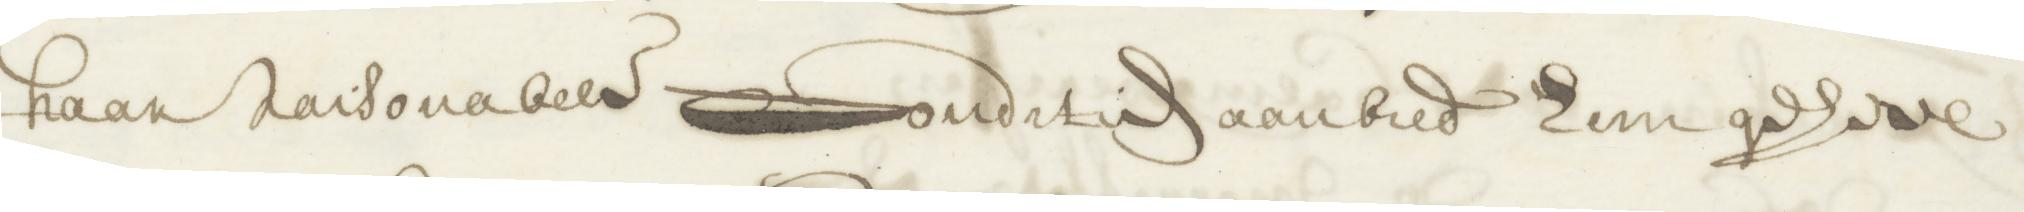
haarraisonabele conditien aanbied hem geheel
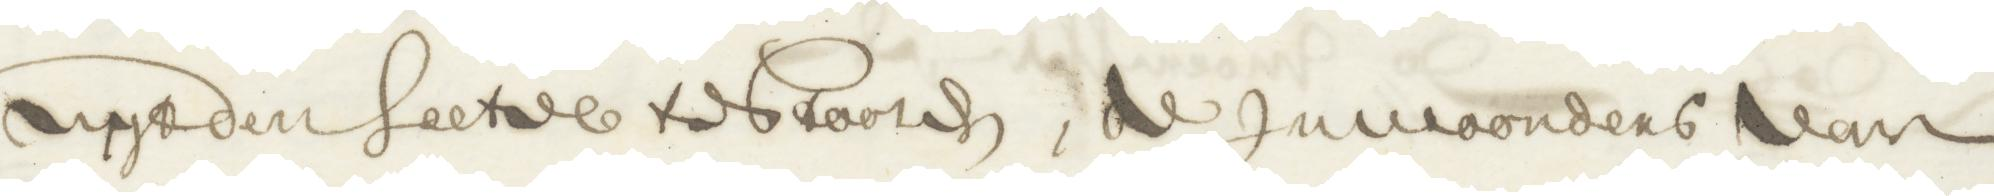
uijtden seetel testooten, de inwoorders van
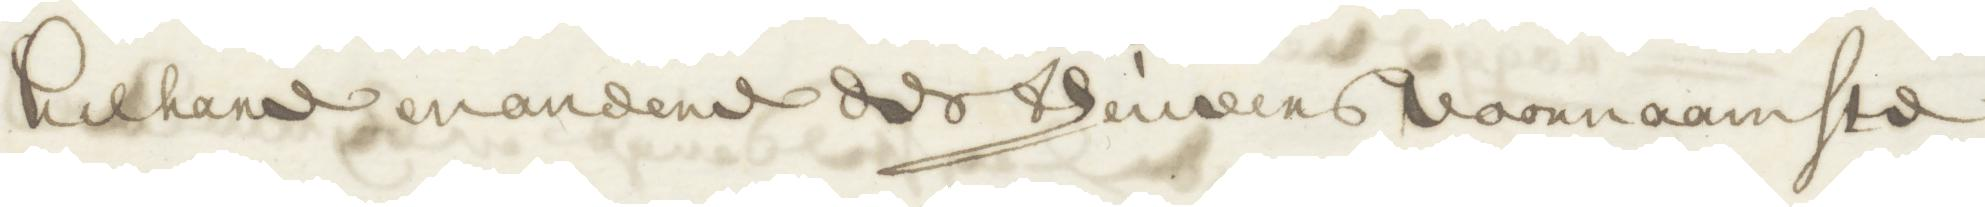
kilkare enandere destheuvers voornaamste
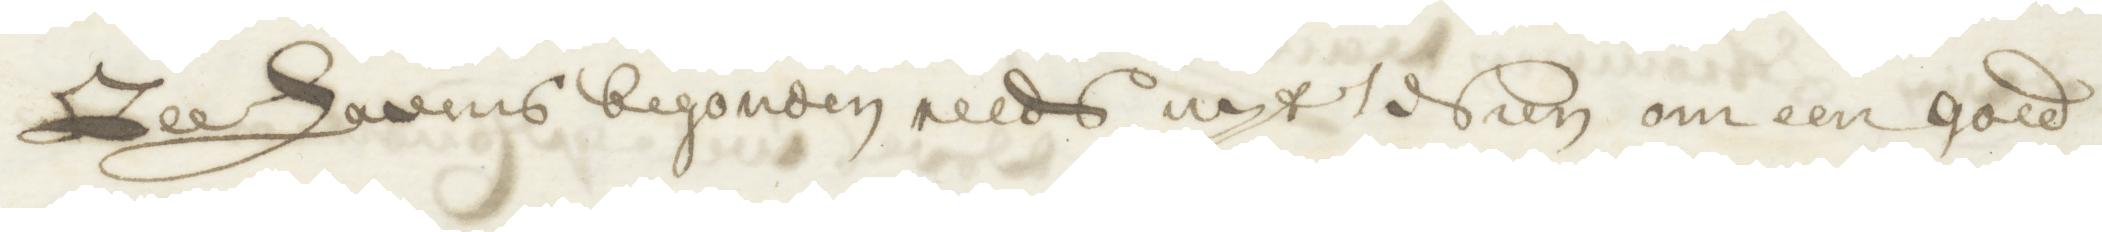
Zee havens begonden reeds uijt tesien om een goed
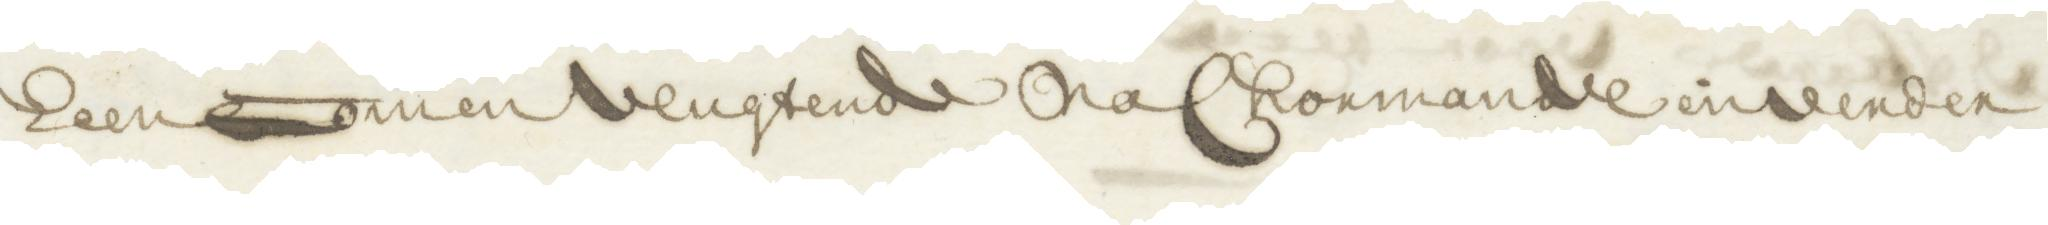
heencomenvlugtende naChormandel enverder
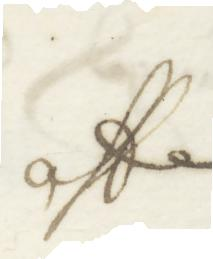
aff
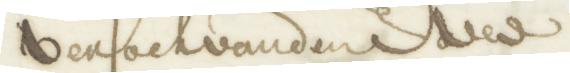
versoek van den Edele
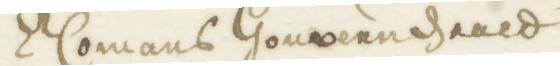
E'Comans Gouvern en raed
